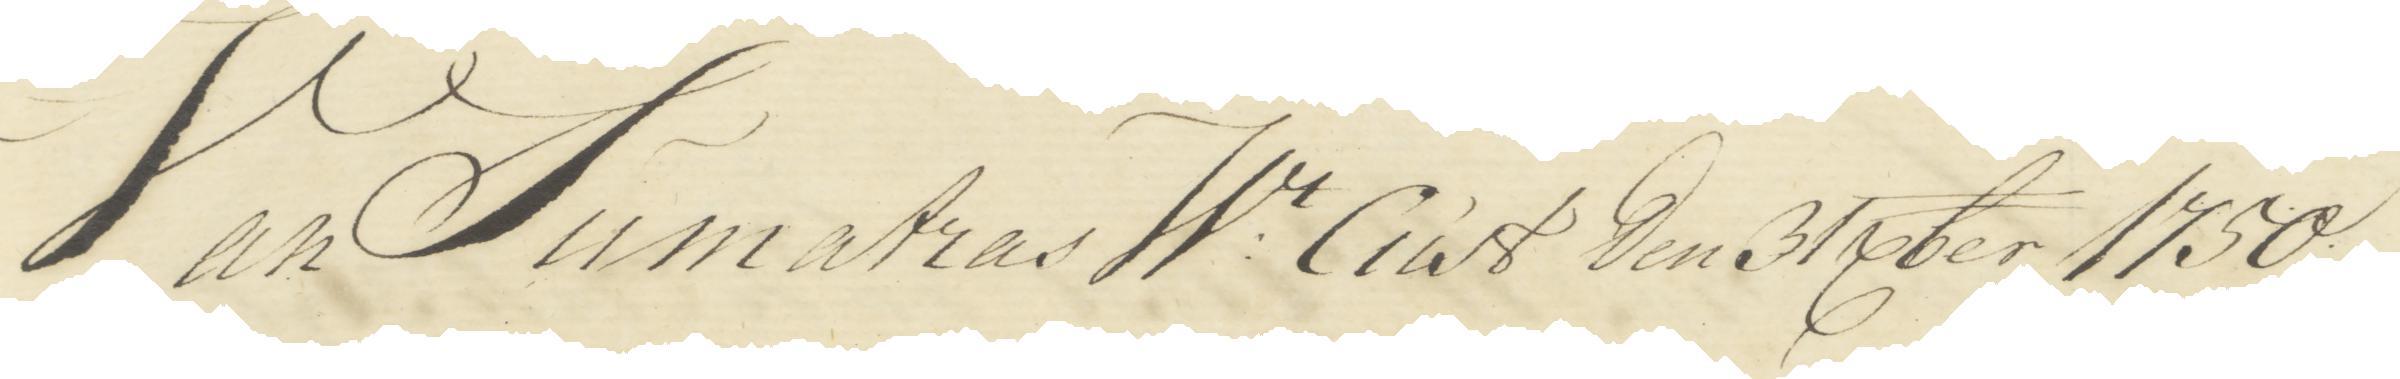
Van Sumatras W:t Cust den 31 xber 1750: _
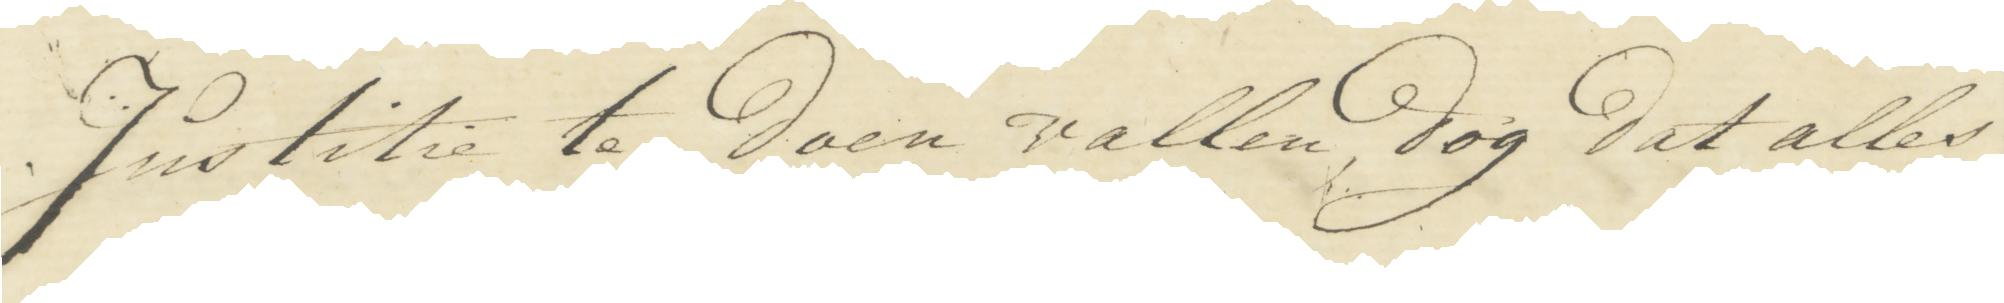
Justitie te doen vallen, dog dat alles
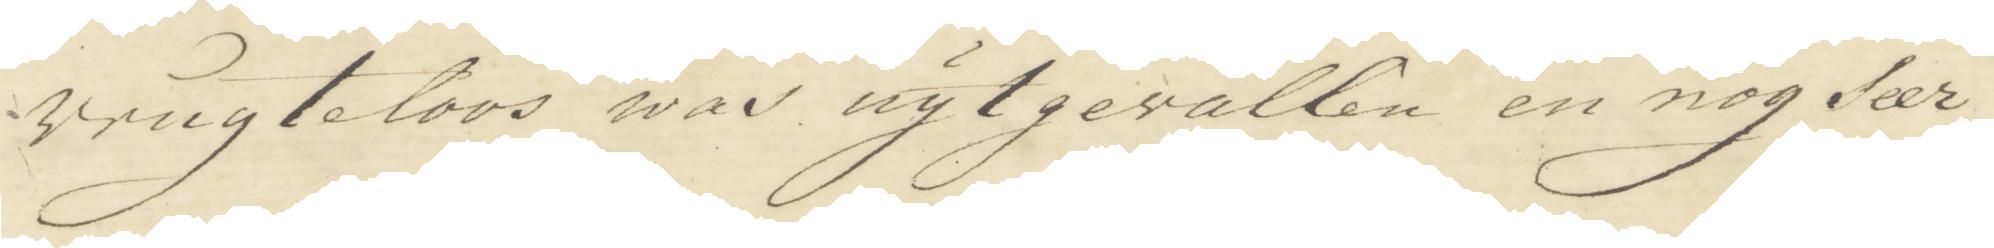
vrugteloos was uijt gevallen en nog seer
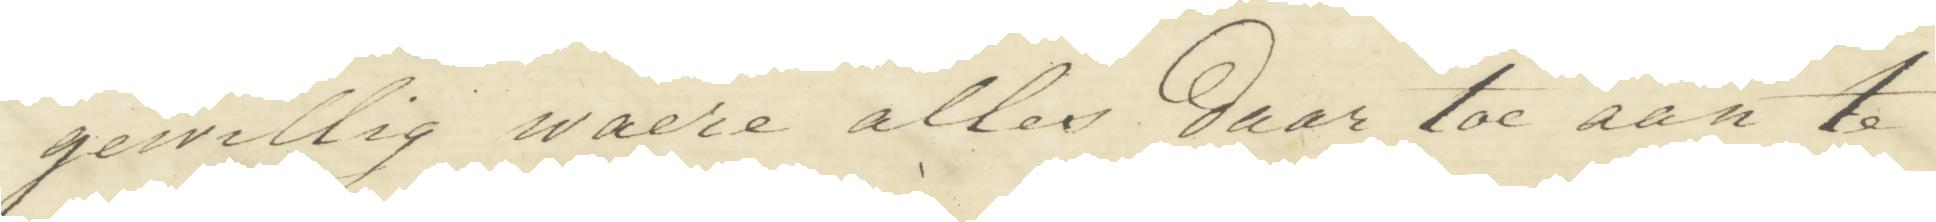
gewillig waere alles daar toe aan te
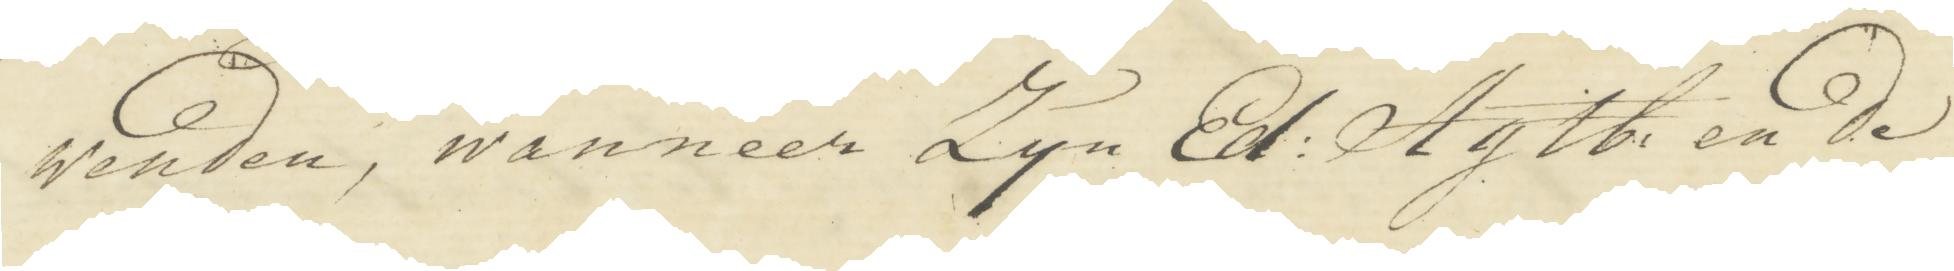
wenden, wanneer Zijn Ed: Agtb: en de
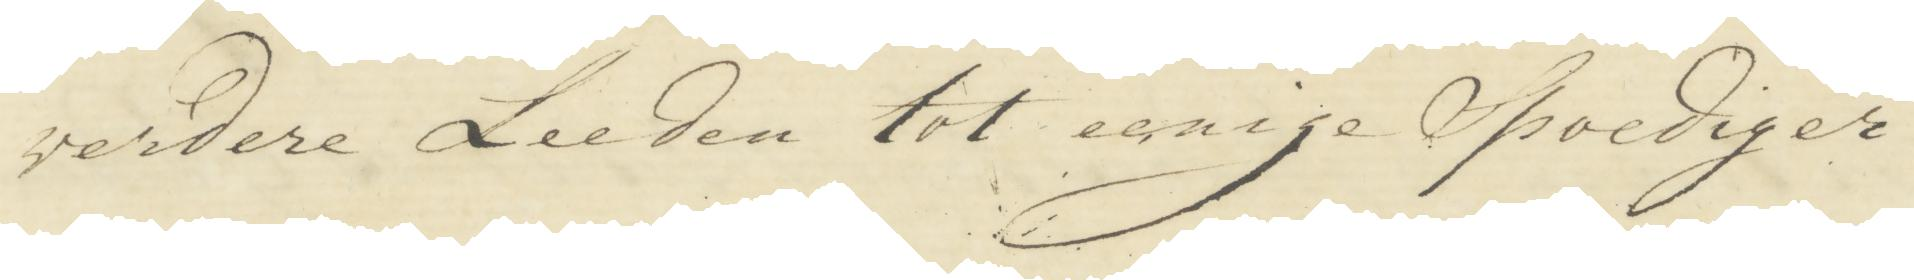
verdere Leeden tot eenige spoediger
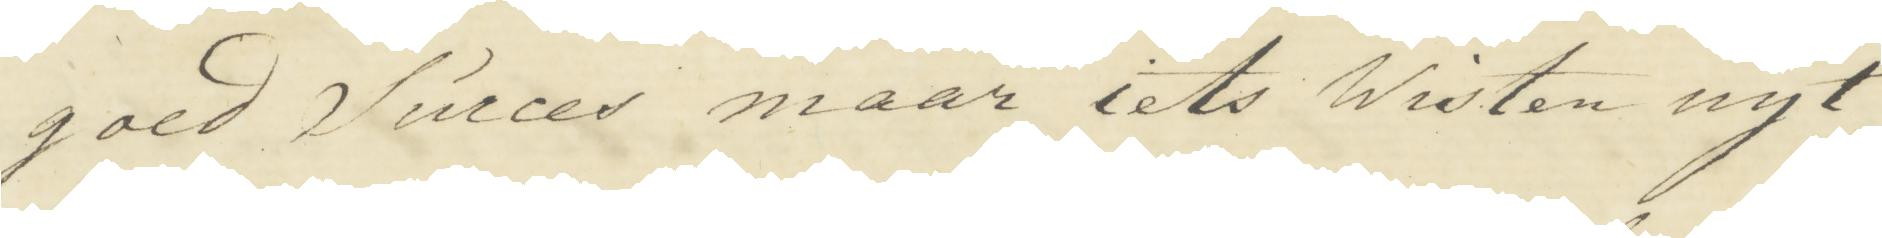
goed succes maar iets wisten uijt
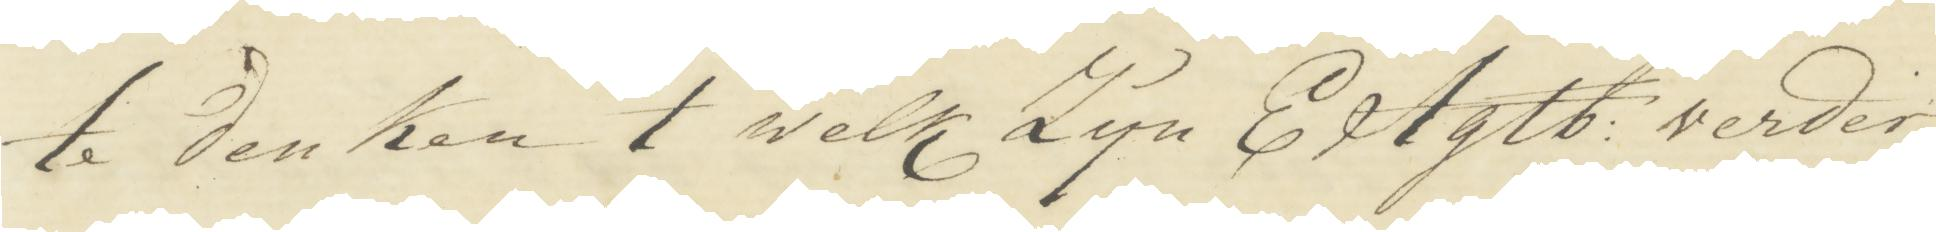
te denken 't welk Zijn E Agtb: verder
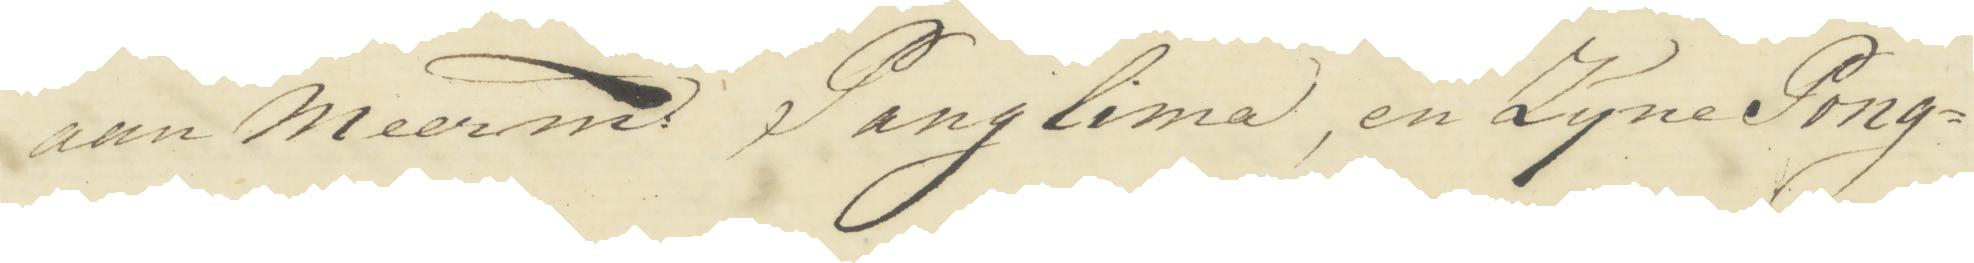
aan Meerm: Panglima, en Zijne Pong=
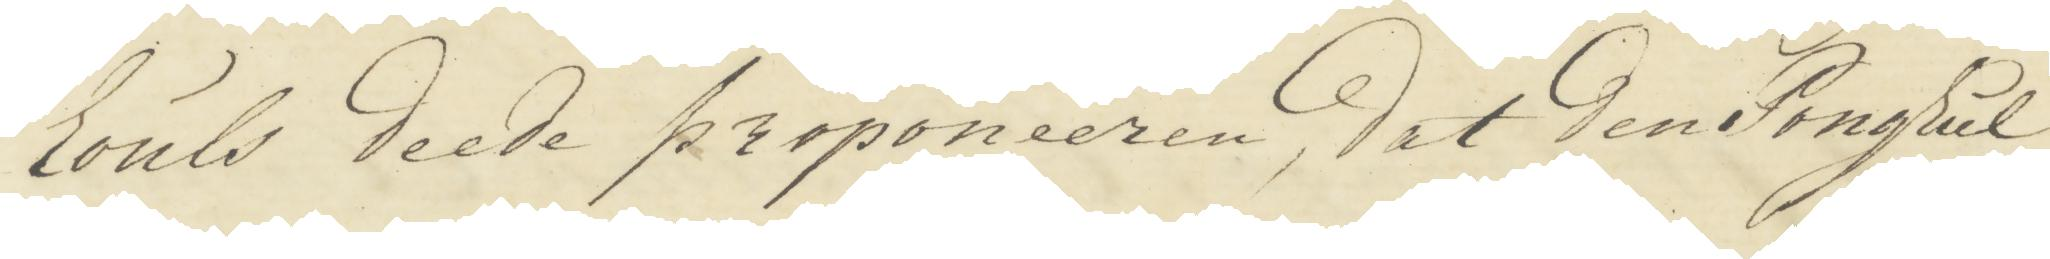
houls deede proponeeren, dat den Ponghul
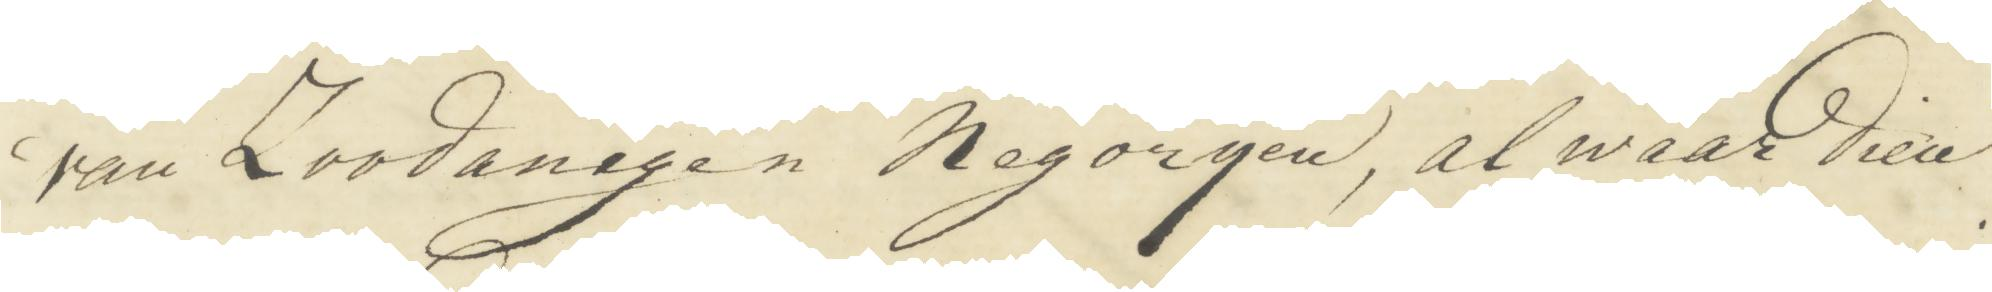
van Zoodanigen negorijen, al waar dien
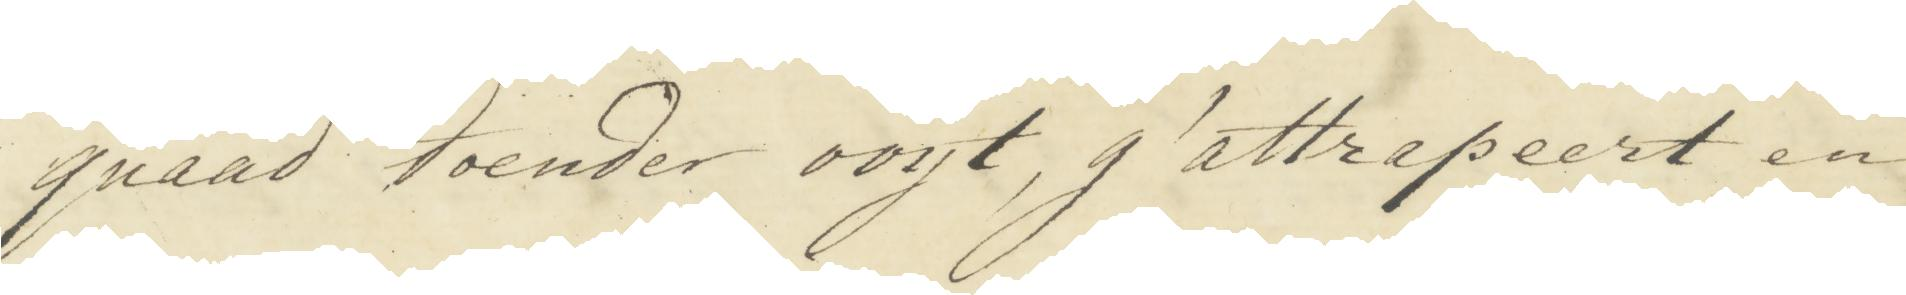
quaad doender ooijt, g’attrapeert en
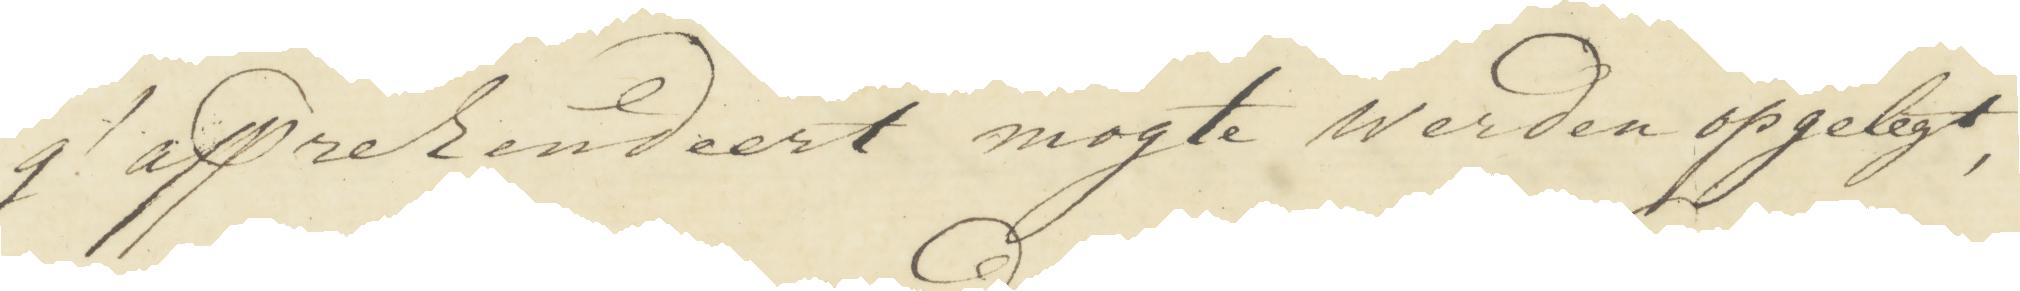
g'apprehendeert mogte werden opgelegt,
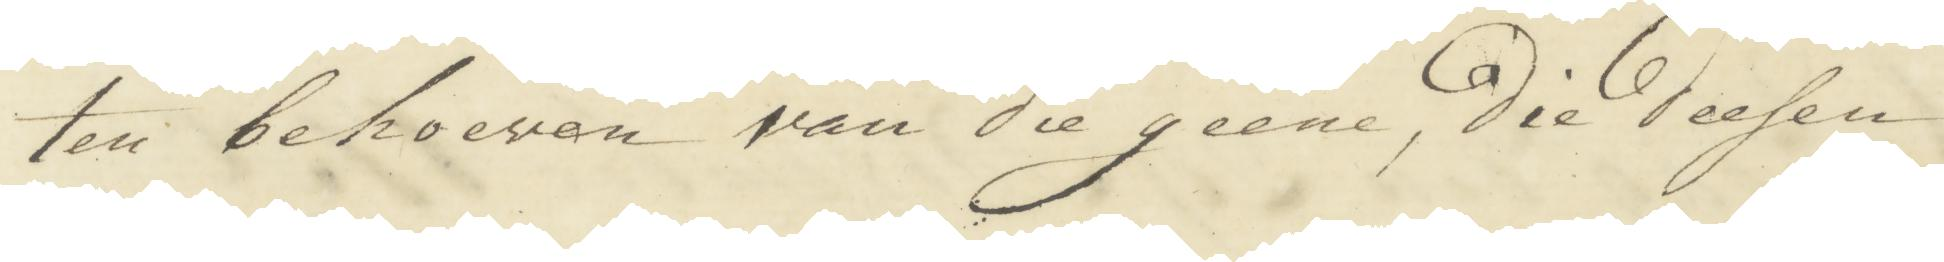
ten behoeven van die geene, die deesen
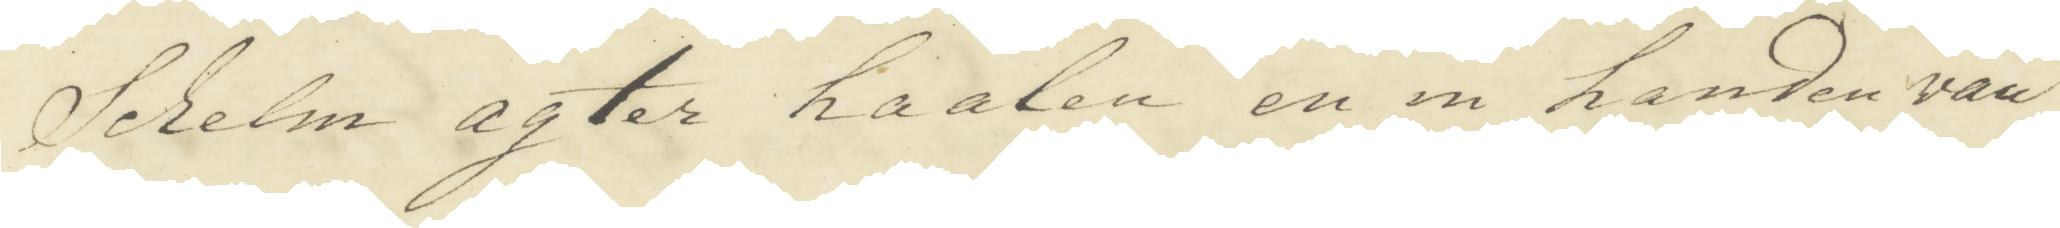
schelm agter haalen en in handen van
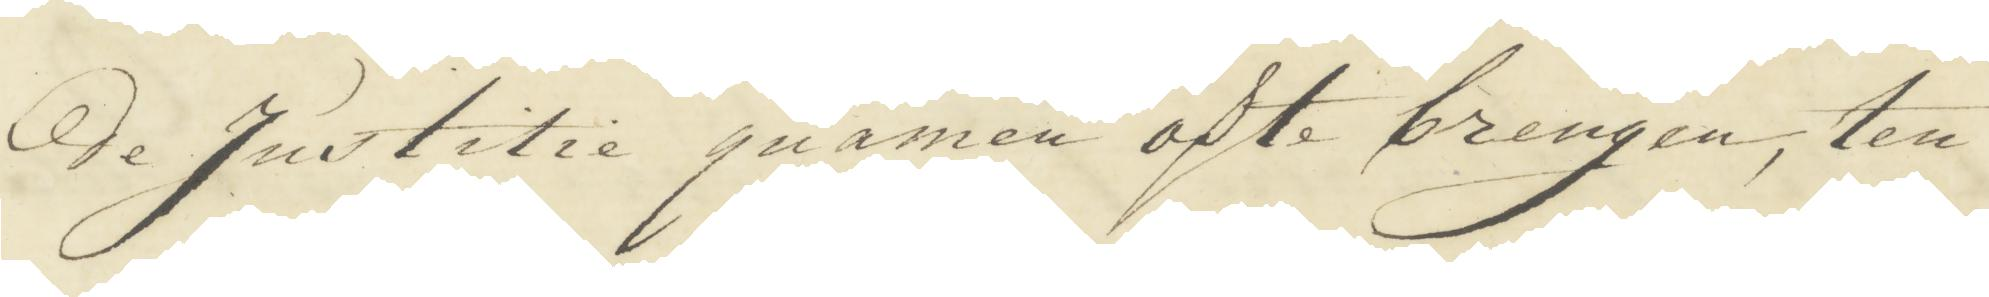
de Justitie quamen overte brengen, ten
